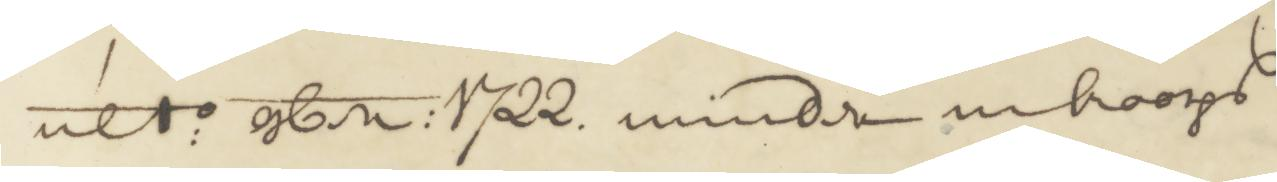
ult:o 9br: 1722. minder inkoops
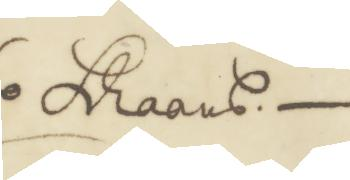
schaars. —
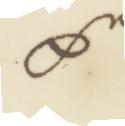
Pr C:to
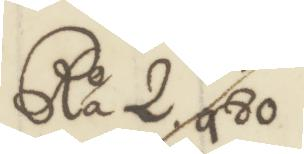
Ro/a 2.927/980
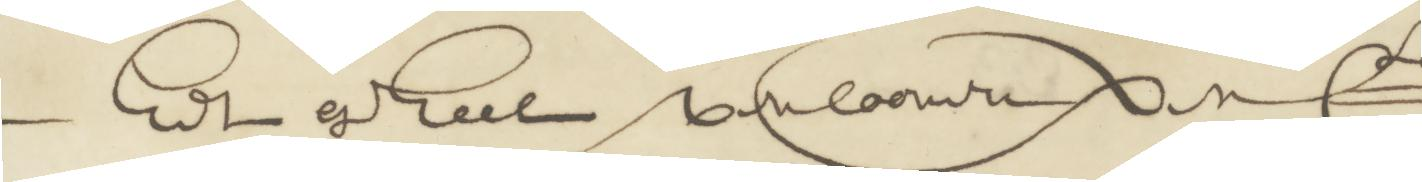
het geheel verlooren per C=to
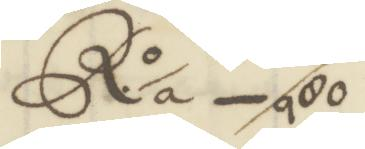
Ro/a — 249/980
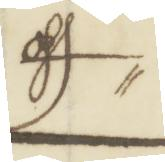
off „ — 83/160
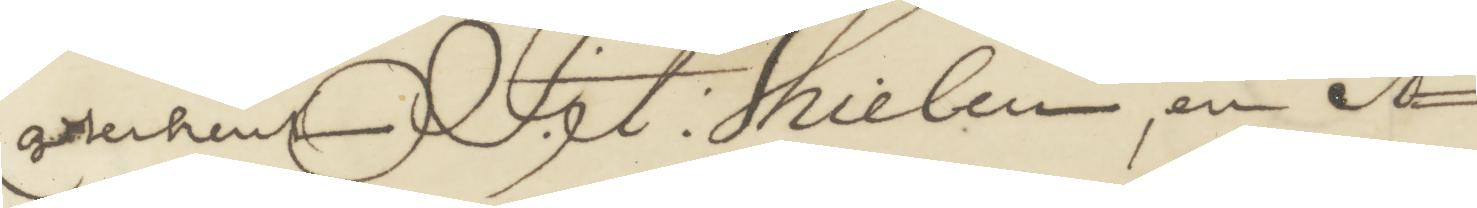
(geteekent) J: A: Thielen, en A=nij van der heulen
